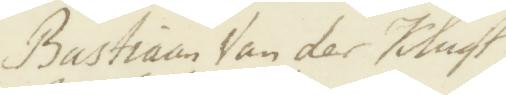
Bastiaan Van der Klugt
